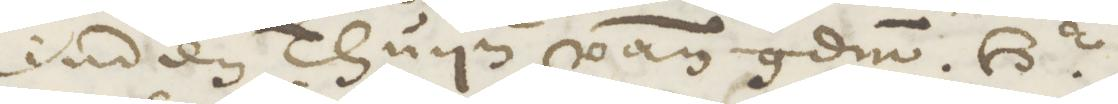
in den thuyn van gem. h.r. majoor
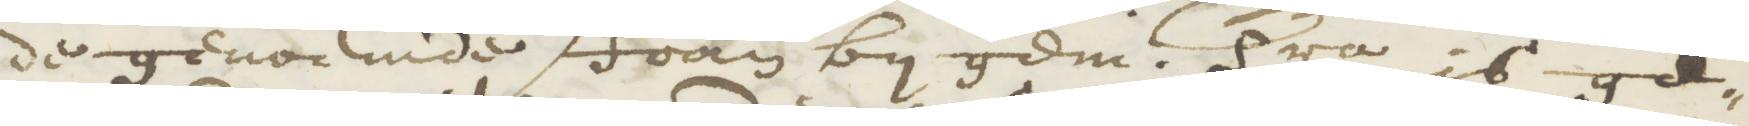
de genoemde Ioan by gem. s.ra is ge„
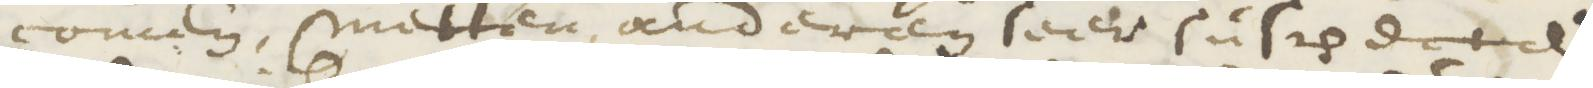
comen, metten, anderen seer suspecte
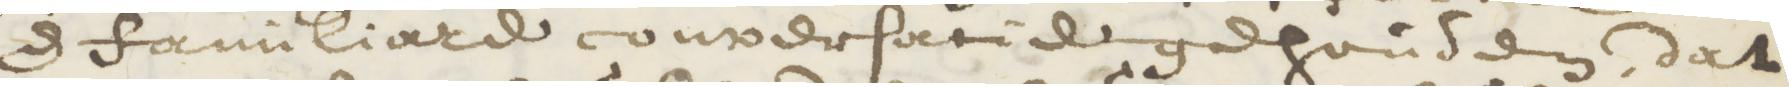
ende familiare conversatie gehouden, dat
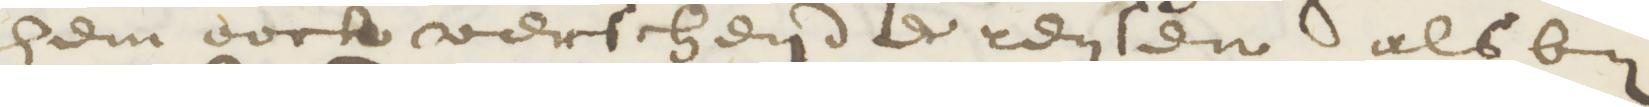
hem oock verscheyder reysen als by
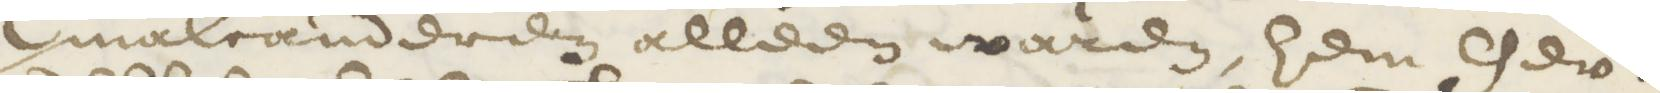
malcanderen alleen waren, hem gev.
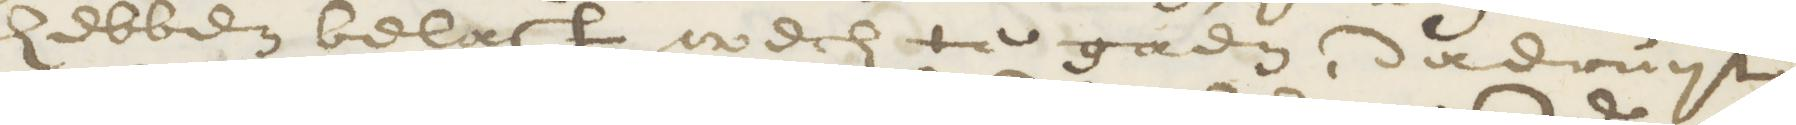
hebben balast wech te gaen, daeruyt
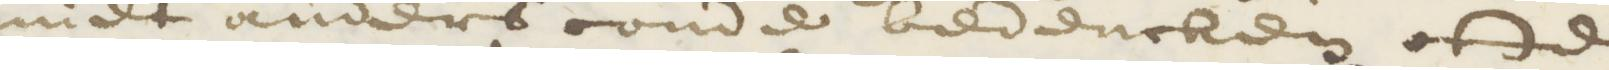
niet anders conde bedencken ofte
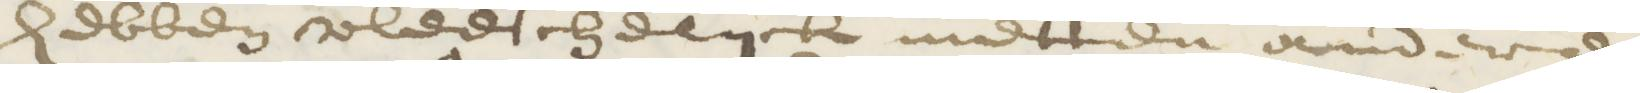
hebben vleeschelyck metten anderen
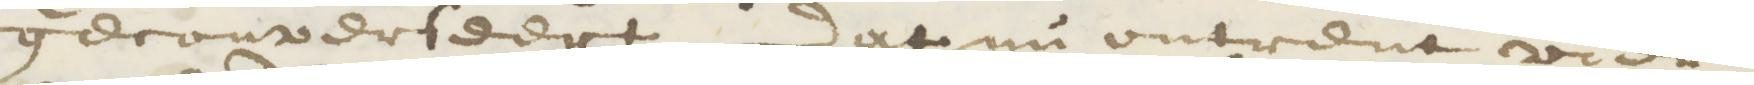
geconverseert, dat nu ontrent vier
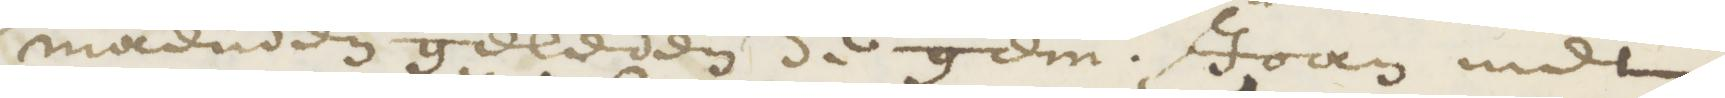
maenden geleden de gem.e Ioan met
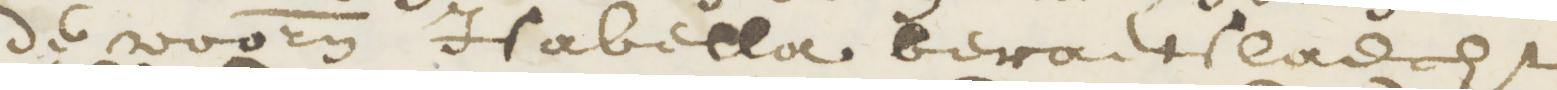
de voorn Isabella beraetslaecht
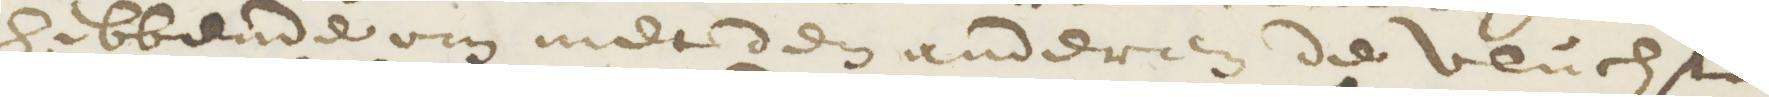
hebbende om met den anderen de vlucht
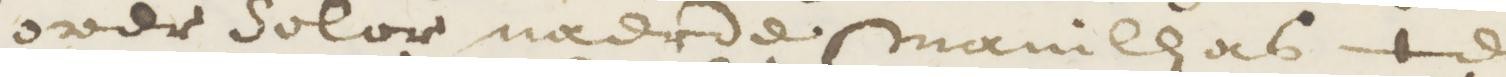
over solor naar de manilhas te
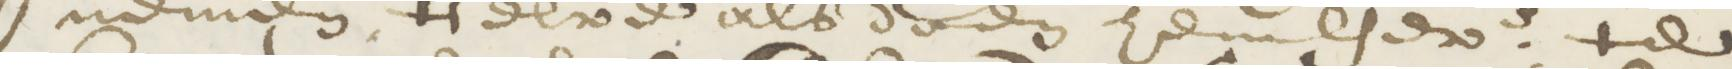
nemen, tselve als doen hem gev.e te
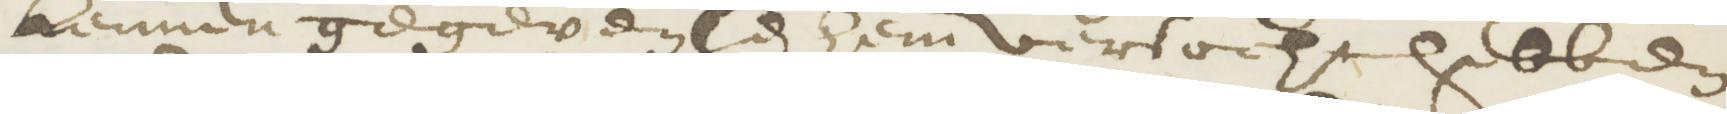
kennen gegeven ende hem versocht hebben
